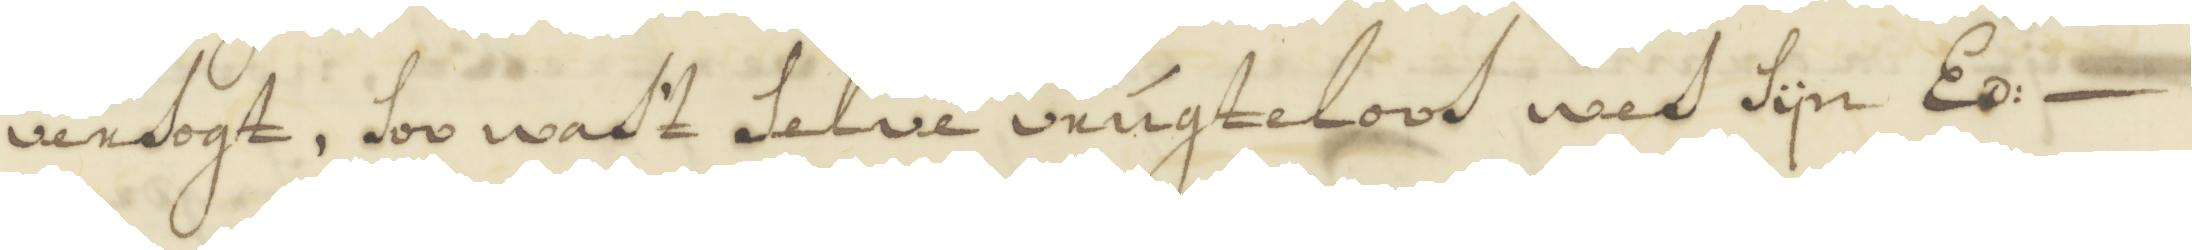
versogt, soo was ’t selve „ vrugteloos wes sijn Ed: —
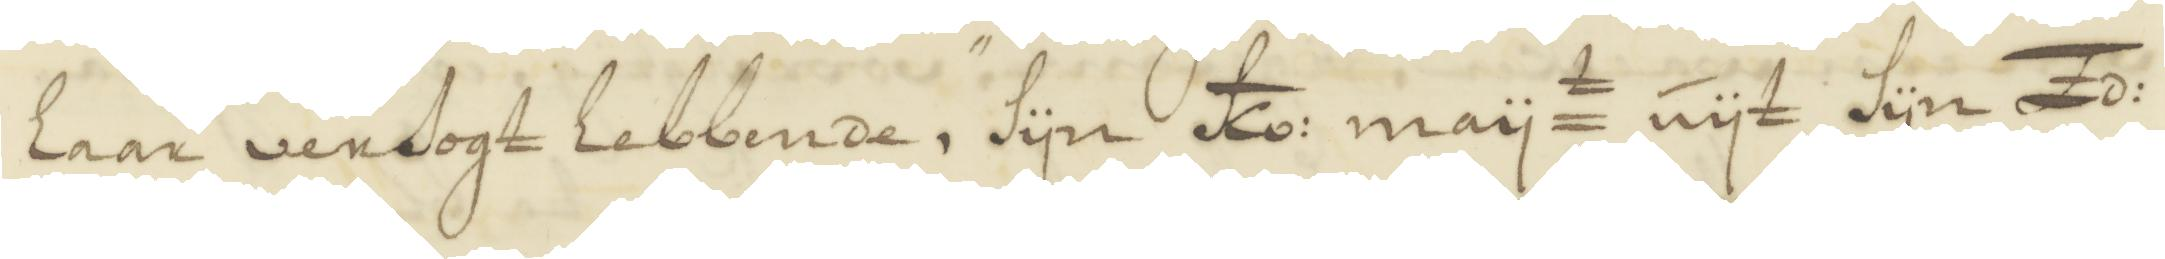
haar versogt hebbende, sijn Ed: maij=t uijt sijn Ed:
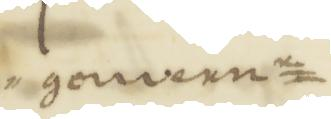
„ gouvern=r
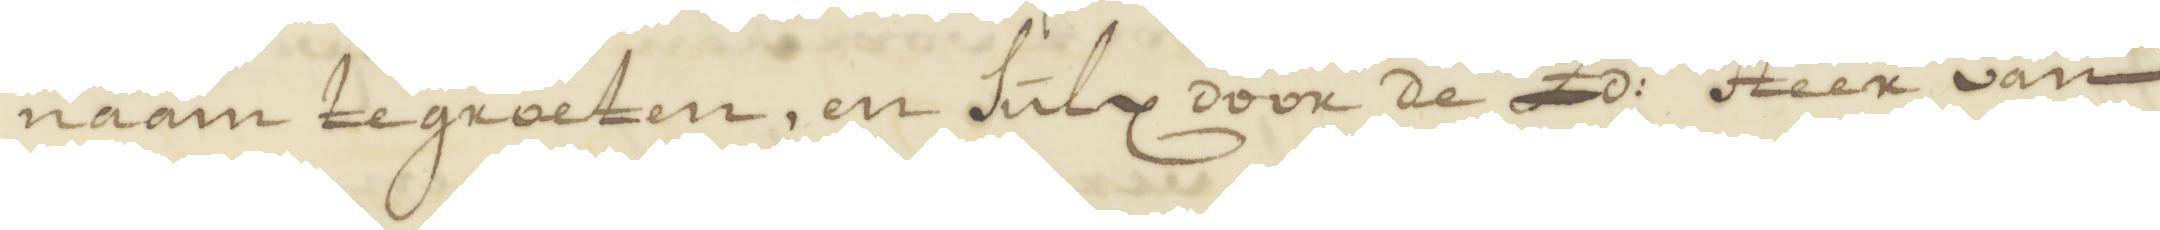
naam te groeten, en sulx door de Ed: Heer „ van
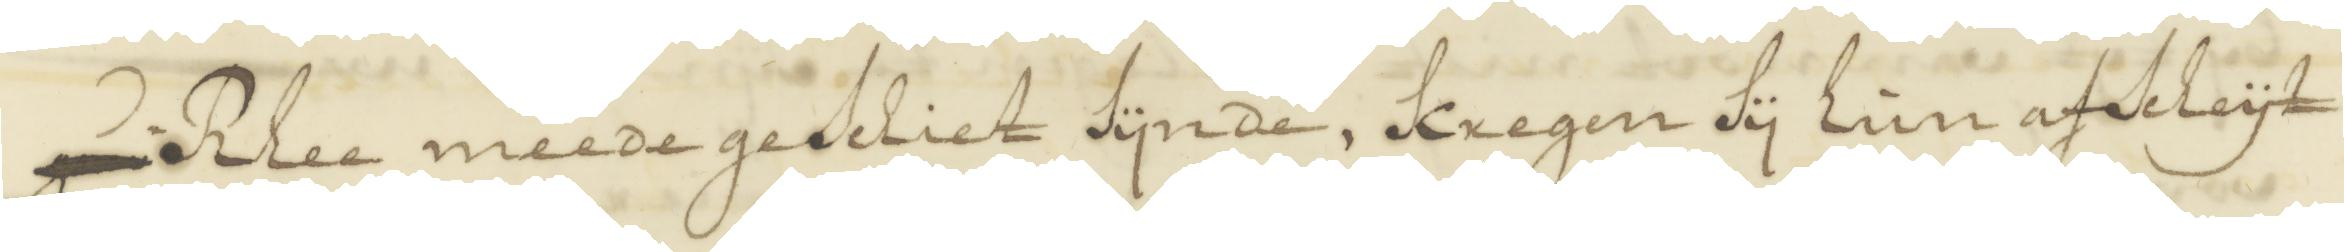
Rhee meede geschiet sijnde, kregen sij hun afscheijt
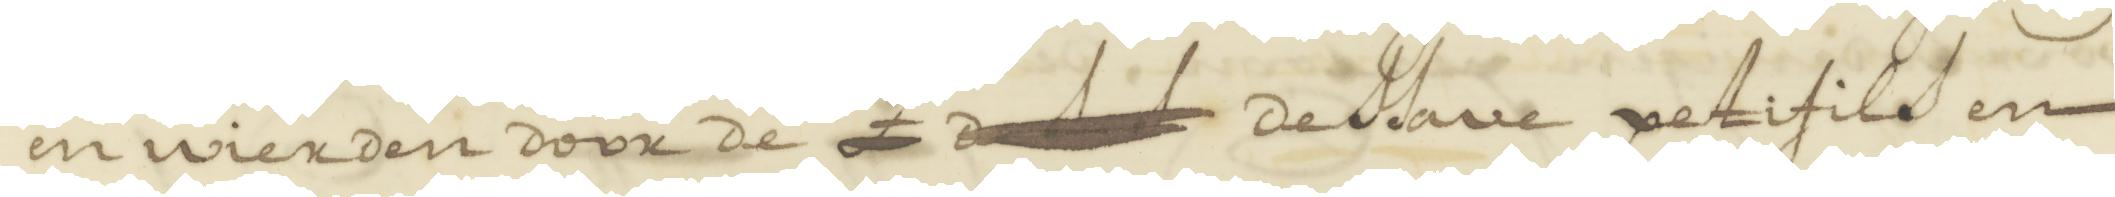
en wierden door de E desas dessave petifils en
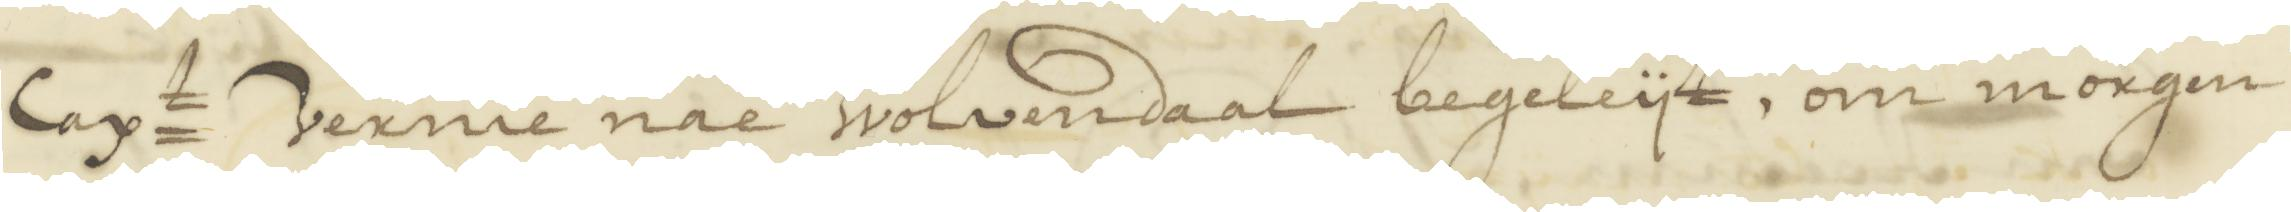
Cap=t Vernie nae wolvendaal begeleijt, om morgen
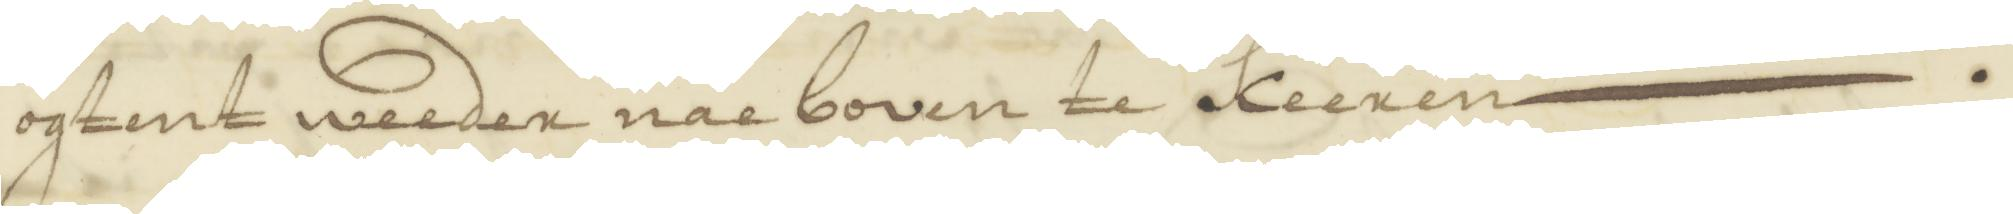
ogtent weeder nae boven te keeren.
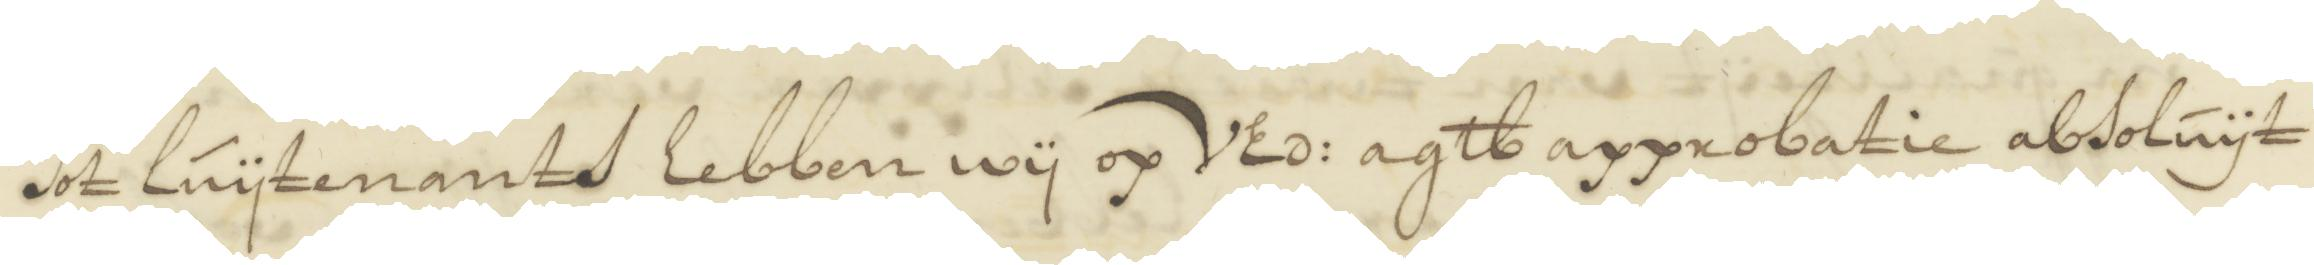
Tot luijtenants hebben wij op VEd: agtb approbatie absoluijt
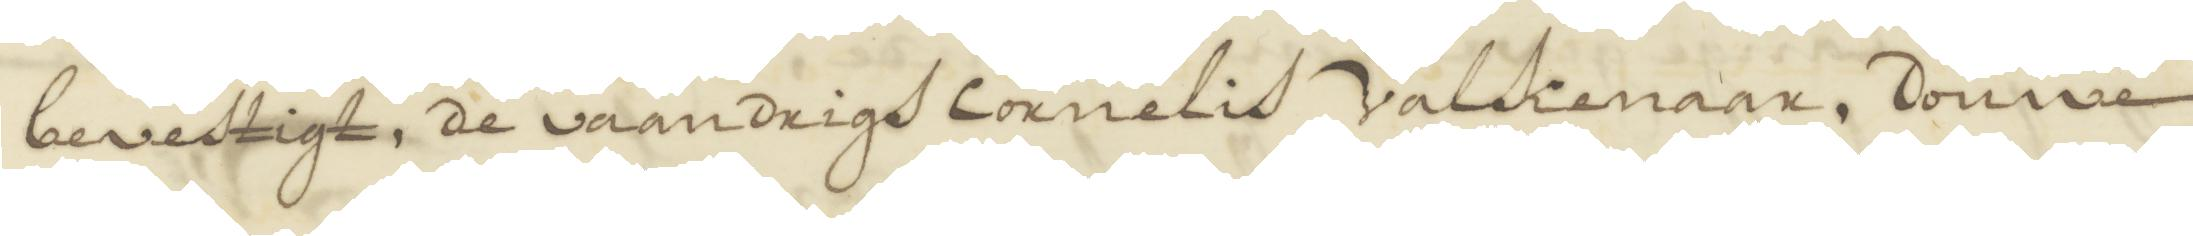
bevestigt, de vaandrigs Cornelis Valkenaar, Douwe
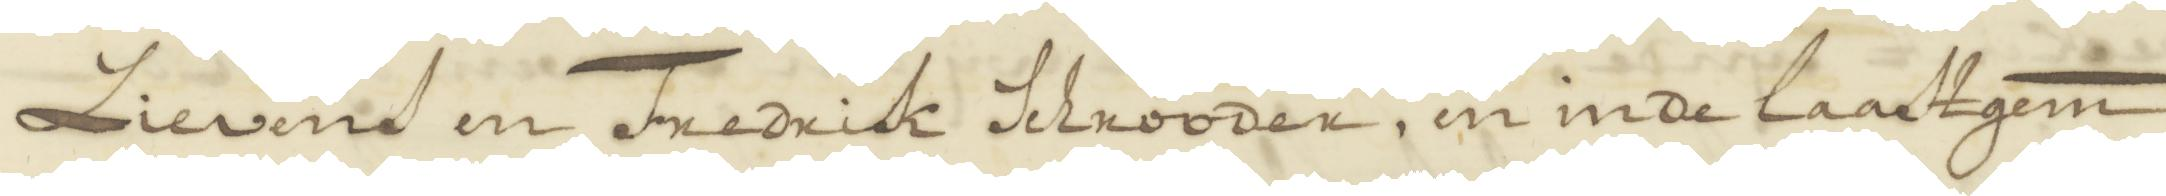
Lievens en Fredrik Schrooder, en in de laastgem
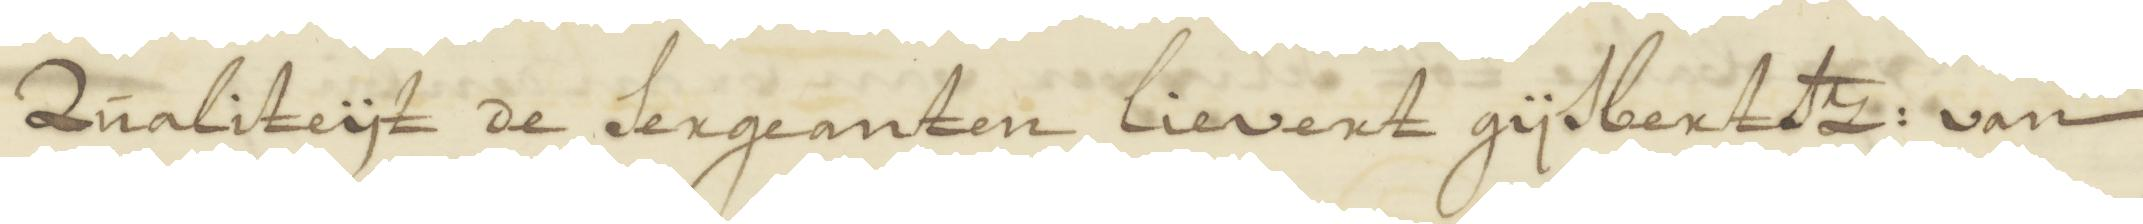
Qualiteijt de sergeanten Lievert gijsbertsz: van
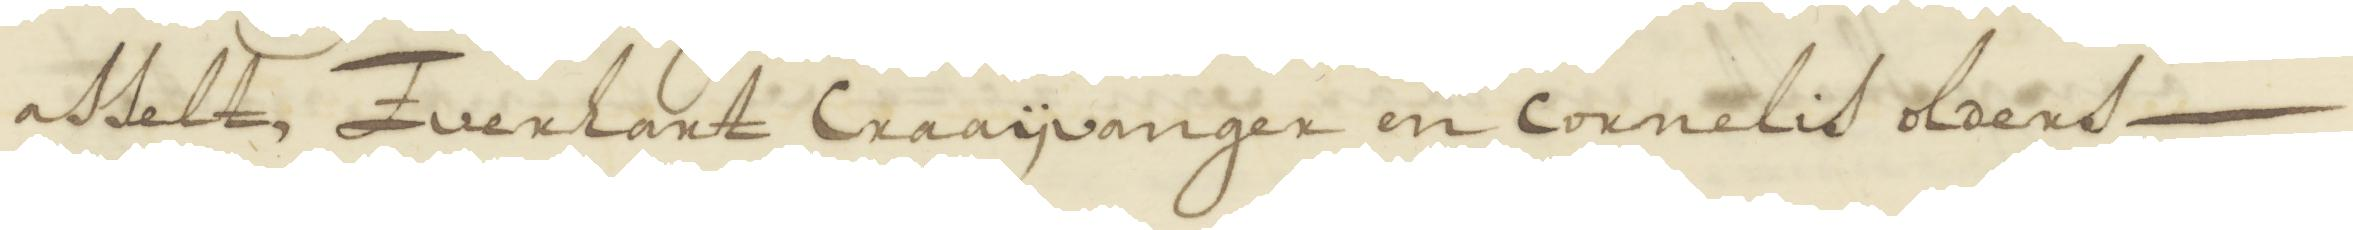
asselt, Everhart Craaijvanger en Cornelis olders —
